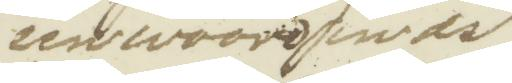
een woord in de
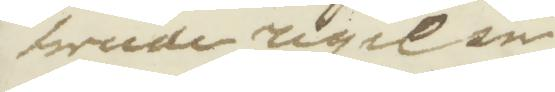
tweede regel en
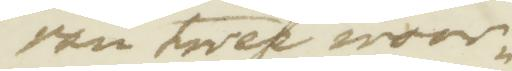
van twee woor„
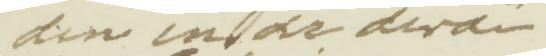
den in de derde
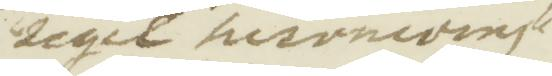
regel hiernevens
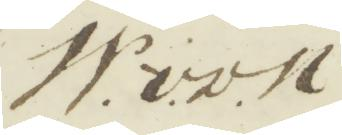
W.v.d.H
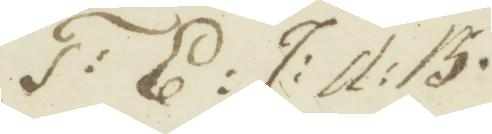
T: E: J:d:B.
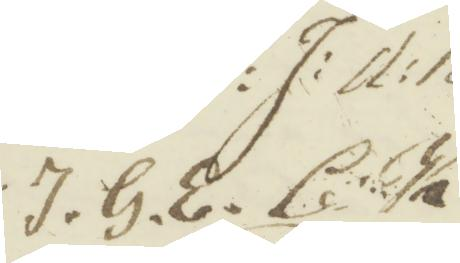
I. G: E. C_ V.
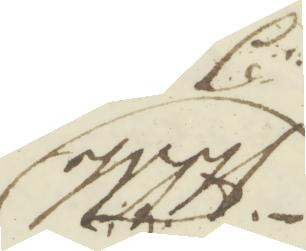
W.A.H._
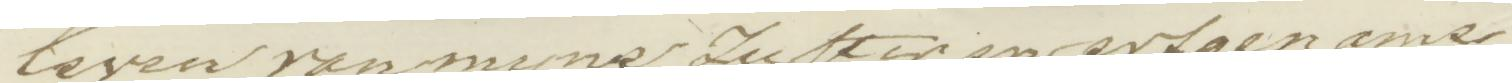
leven van myne Zuster en erfgename
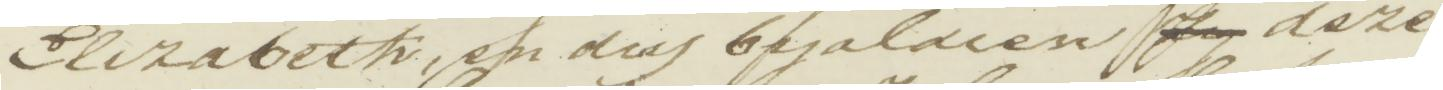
Elizabeth, en dies by aldien zy deze
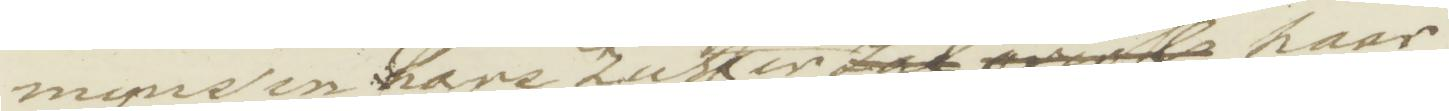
myne en hare zuster zal overle haar
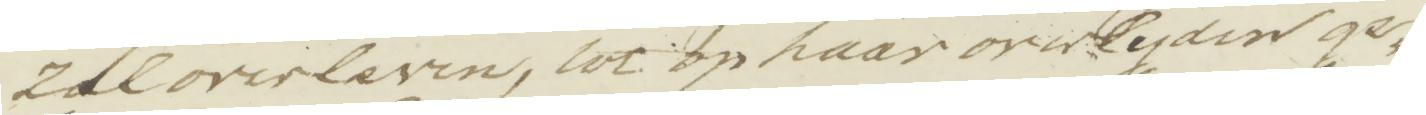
zal overleven, tot op haar overlyden ge„
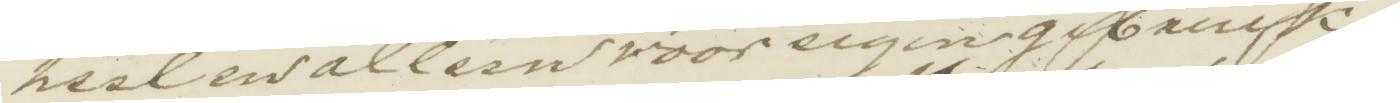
heel en alleen voor eigen gebruyk
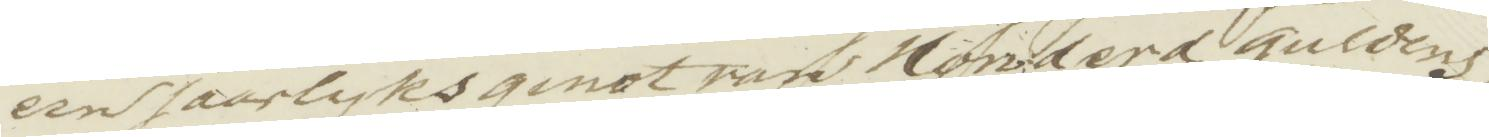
een Jaarlyks genot van Honderd guldens
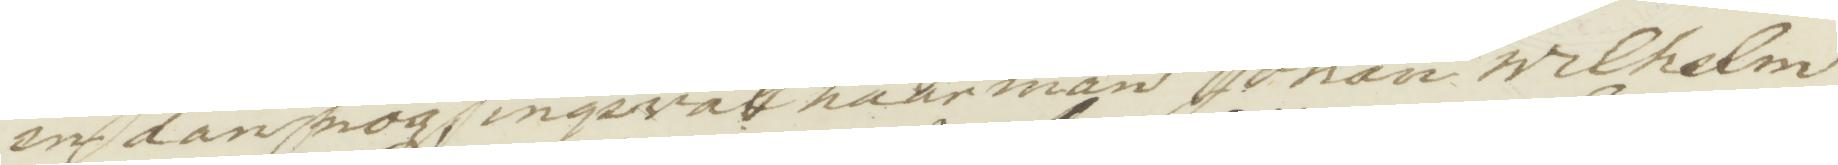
en dan nog, ingeval haar man Johan wilhelm
